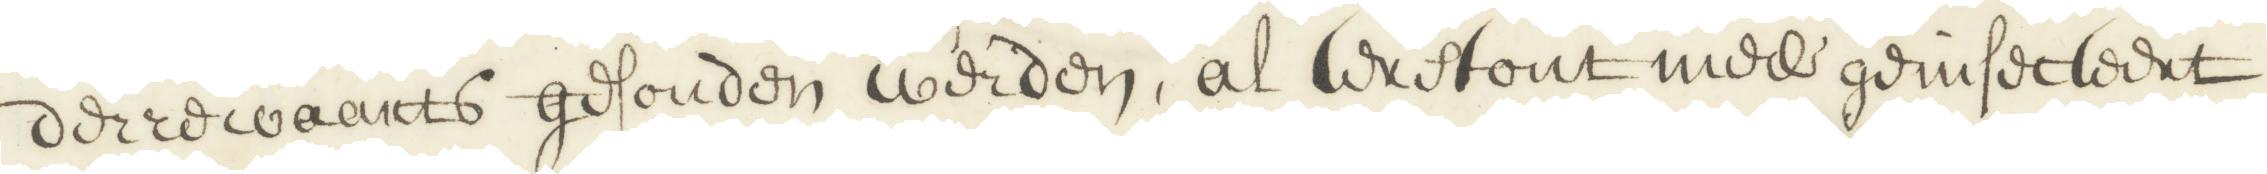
derrewaarts gesonden werden, al terstont mede geinfecteert
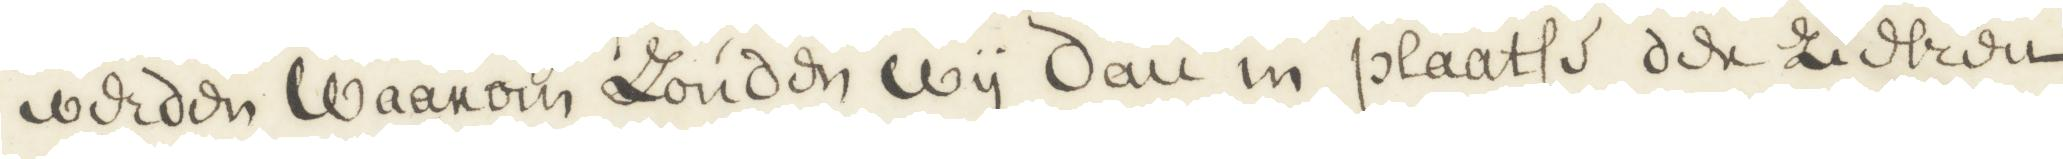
werden waarom zouden wij dan in plaatse der zieken
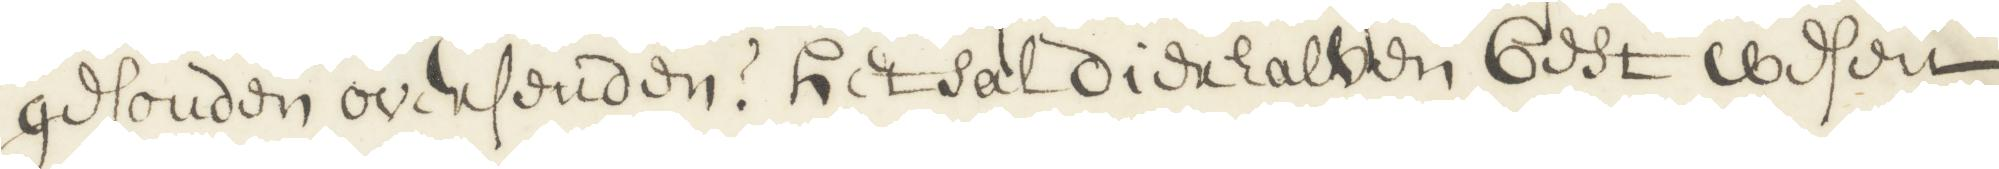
gesonden oversenden; het sal dierhalven best wesen
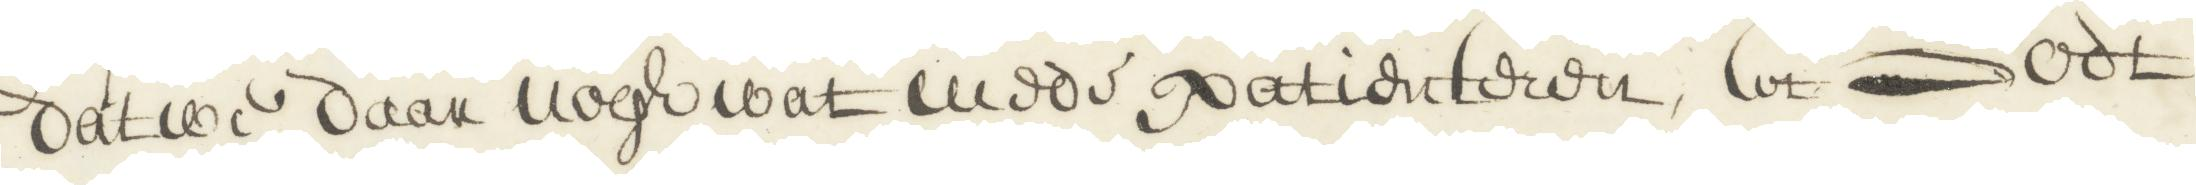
datwe daar nogh wat mede patienteren, tot Godt
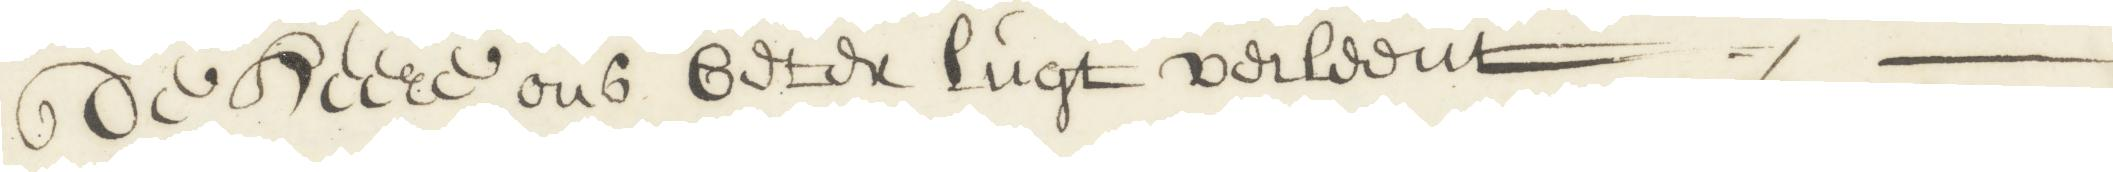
de Heere ons beter lugt verleent./ —
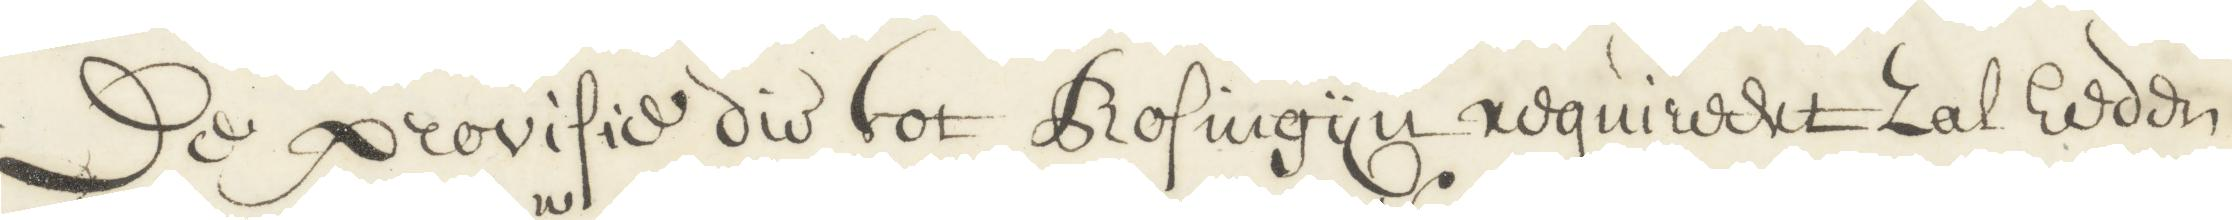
De provisie die tot Rosingijn requireert zal heden
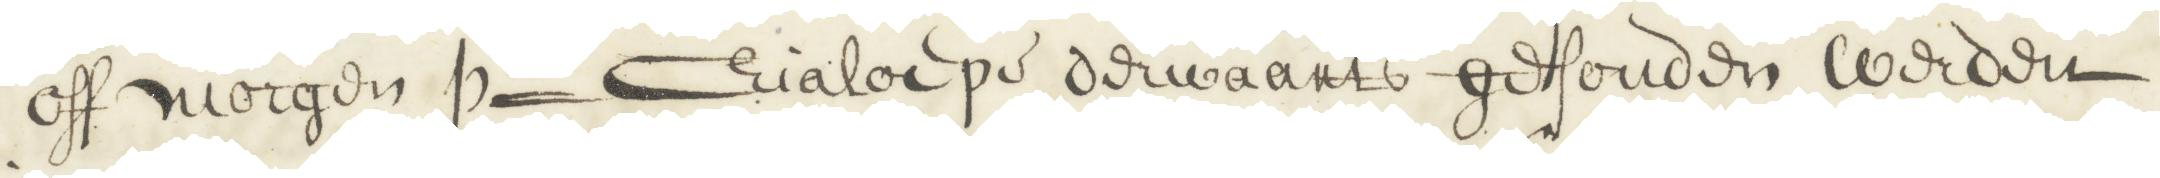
off morgen p=m Chialoepe derwaarts gesonden werden
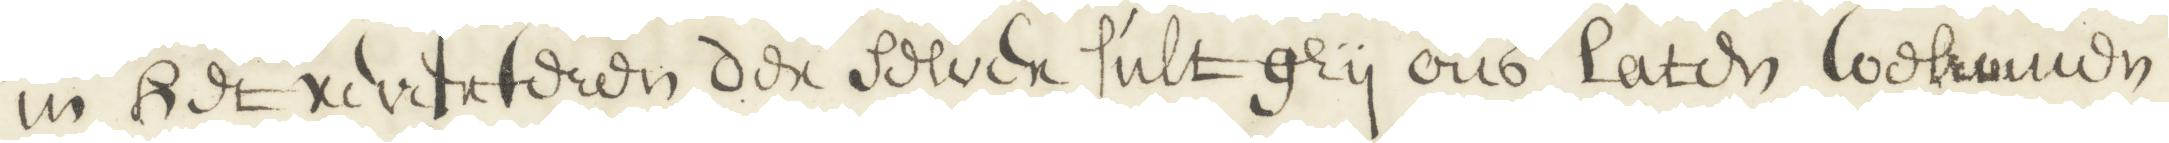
in het reverteren der selver sult ghij ons laten toekomen
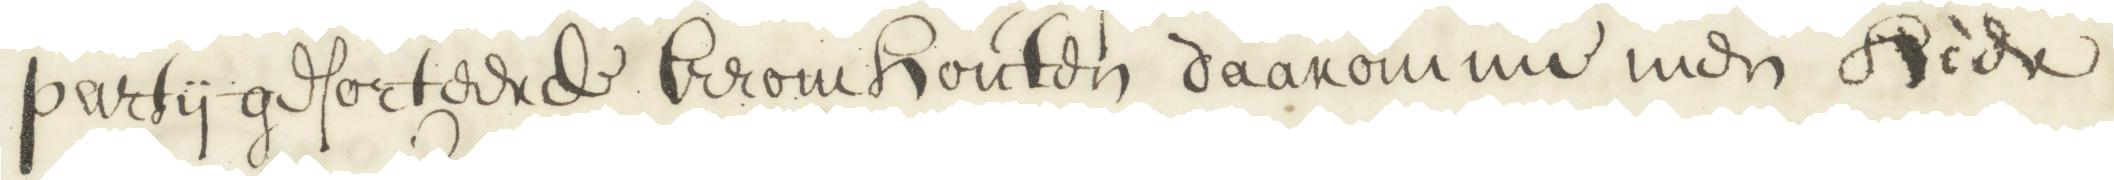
partij gesorteerde kromhouten daaromme men Hier
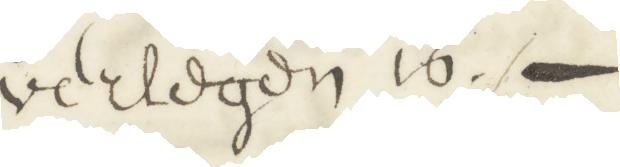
verlegen is./ —
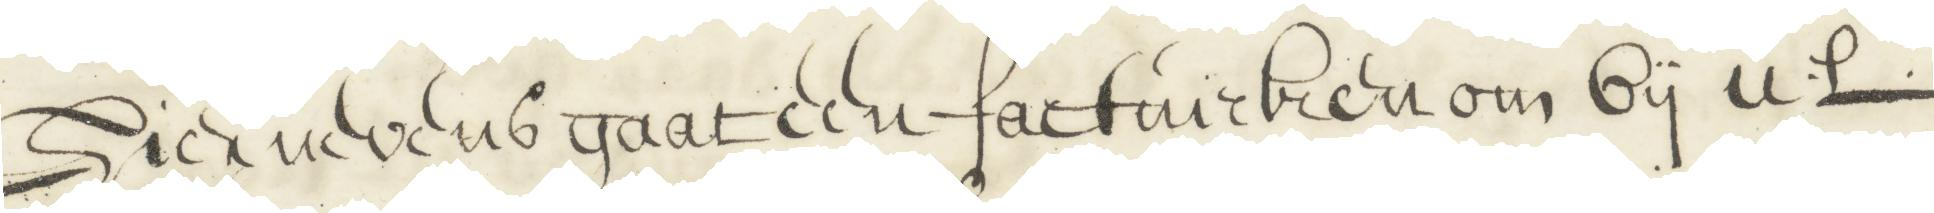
Hier nevens gaat een factuirken om bij ul
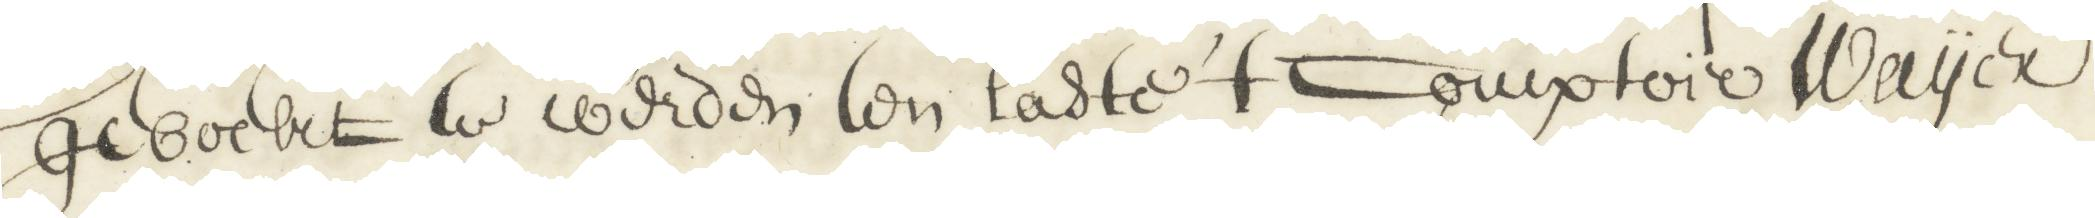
geboekt te werden ten laste ’t Comptoir Waijer
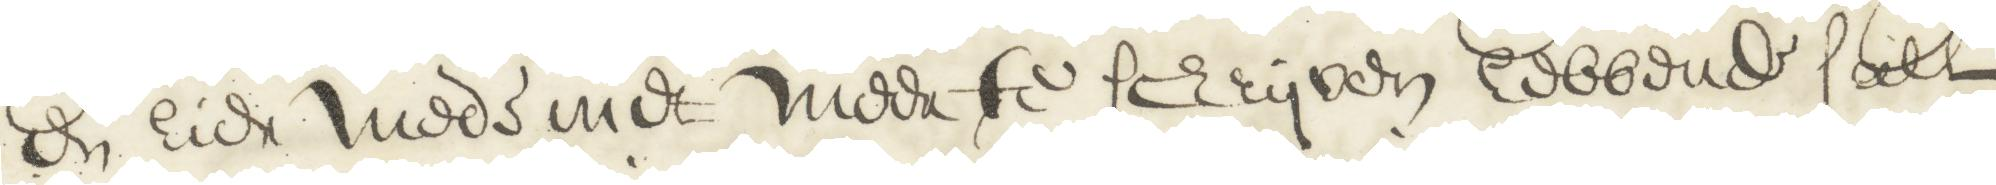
en hier mede niet meer te schrijven hebbende sall
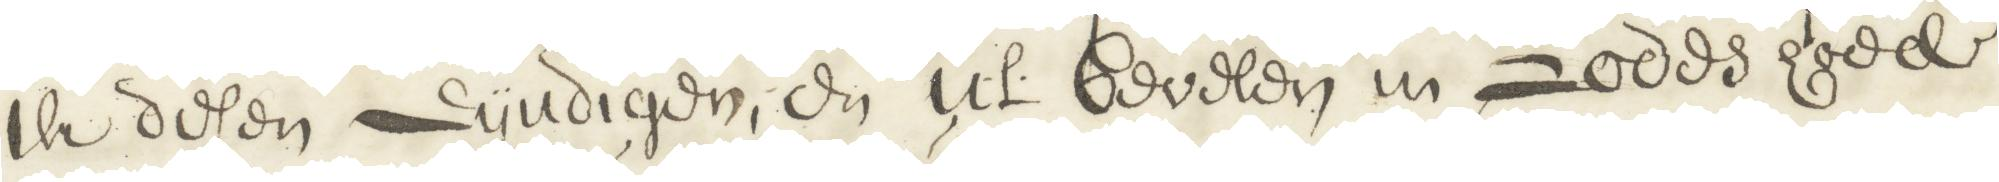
ik desen Eijndigen, en u.l. bevelen in Godes hoede
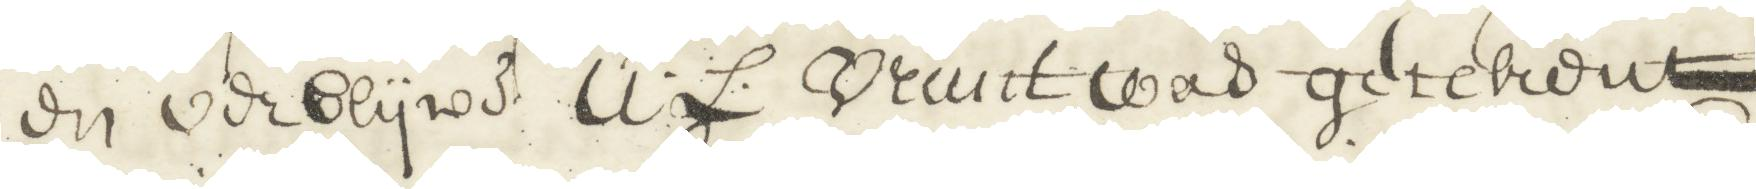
en verblijve U.L. vrunt was getekent
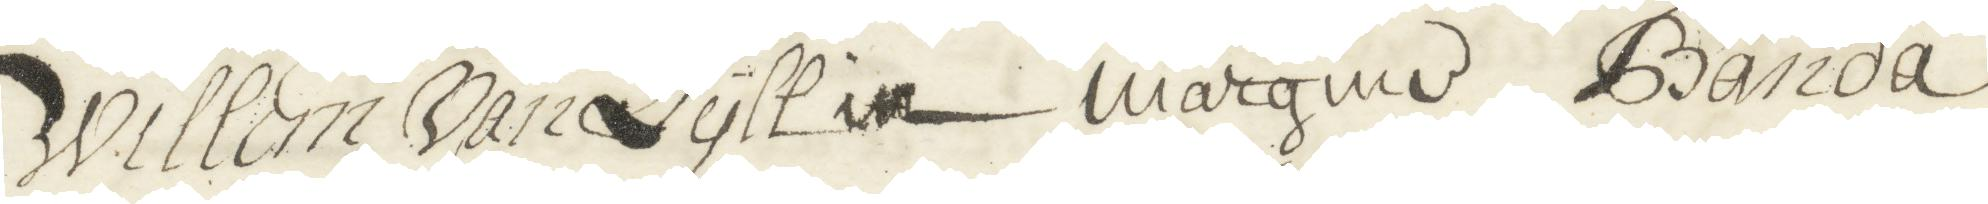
Willem van Zijll in margine Banda
